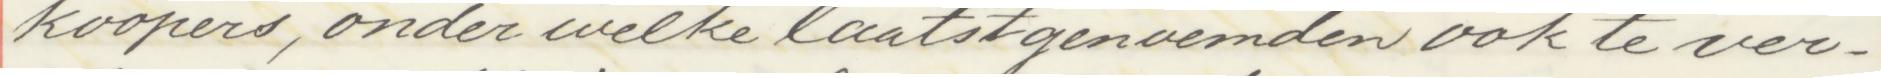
koopers, onder welke laatstgenoemden ook te ver-
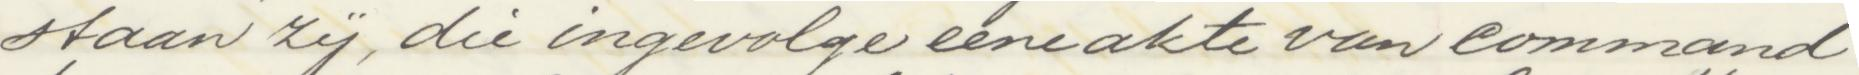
staan zij, die ingevolge eene akte van command
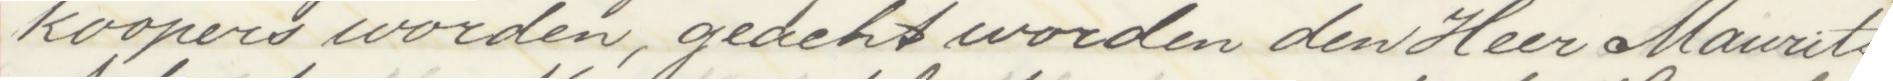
koopers worden, geacht worden den Heer Maurits
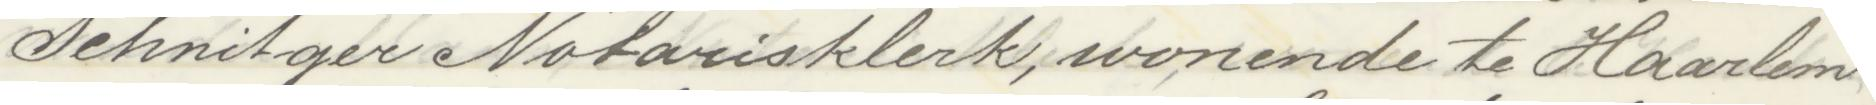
Schnitger Notarisklerk, wonende te Haarlem
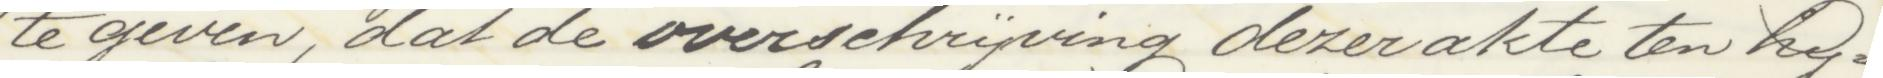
te geven, dat de overschrijving dezer akte ten hy„
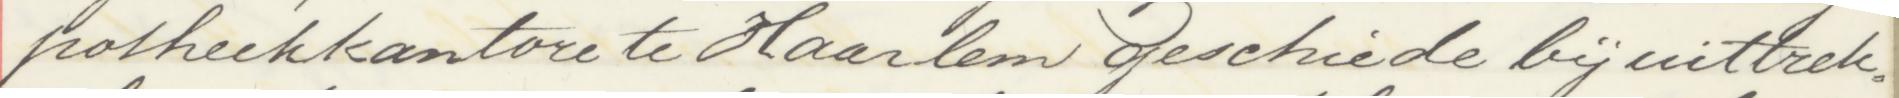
potheekkantore te Haarlem geschiede bij uittrek„
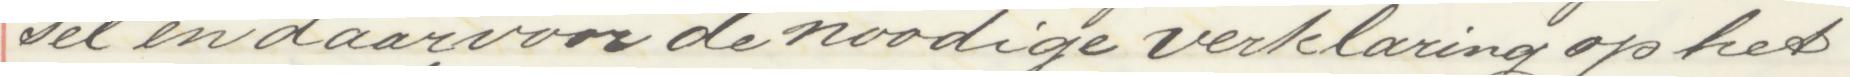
sel en daarvoor de noodige verklaring op het
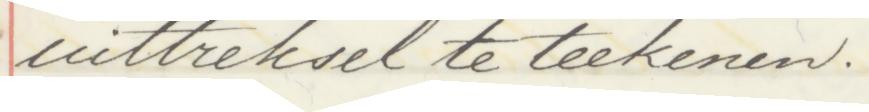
uittreksel te teekenen.
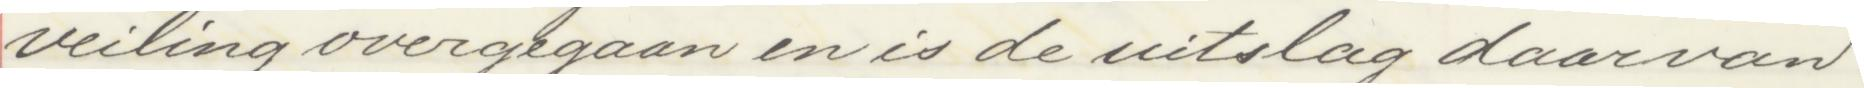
veiling overgegaan en is de uitslag daarvan
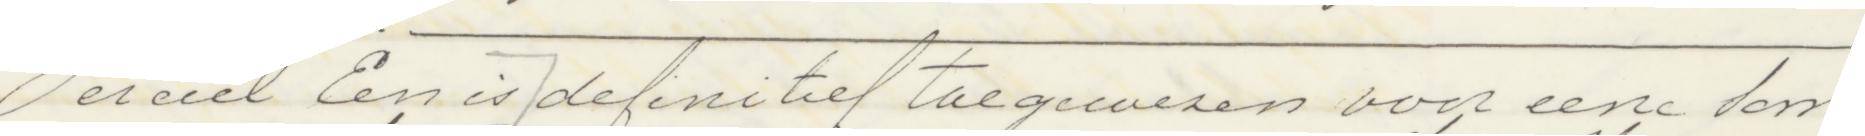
Perceel Eene is] definitief toegewezen voor eene som
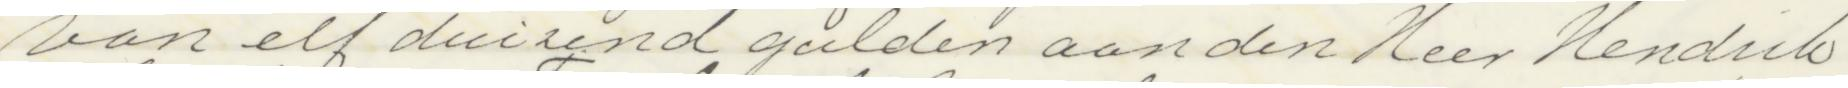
van elf duizend gulden aan den Heer Hendrik
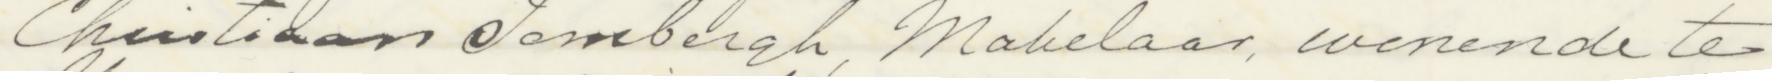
Christiaan Tombergh, Makelaar, wonende te
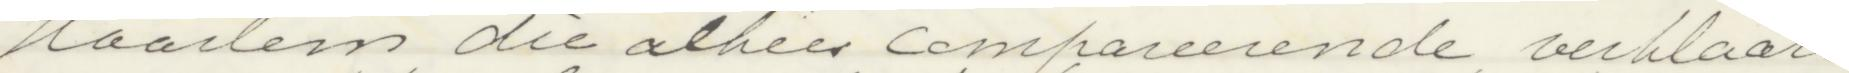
Haarlem, die alhier compareerende, verklaar
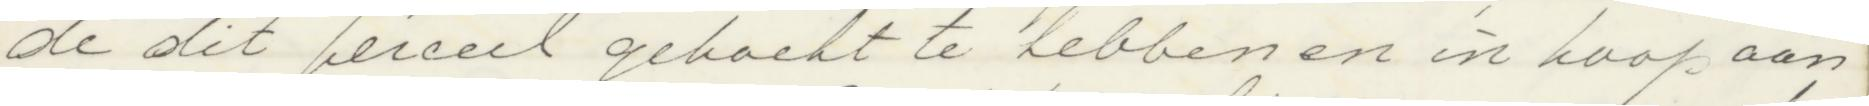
de dit perceel gekocht te hebben en in koop aan
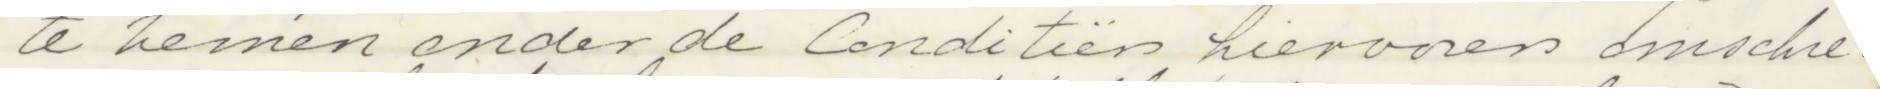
te nemen onder de Conditiën hiervoren omschre=
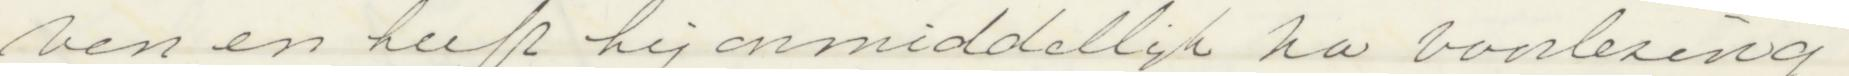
ven en heeft hij onmiddellijk na voorlezing
